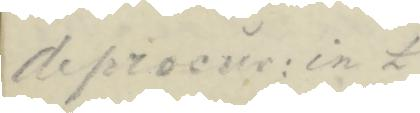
de procur: in 't
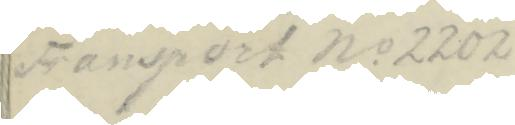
Transport n.o 2202
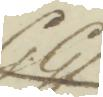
G:GC:
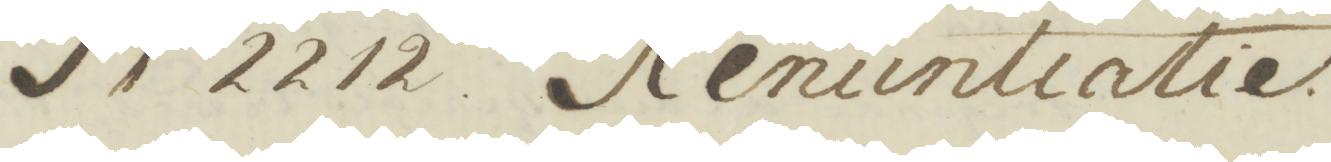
N=.o 2212 Renuntiatie.
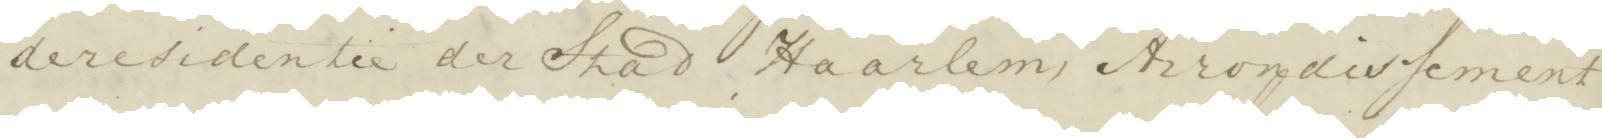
deresidentie der Stad Haarlem, Arrondissement
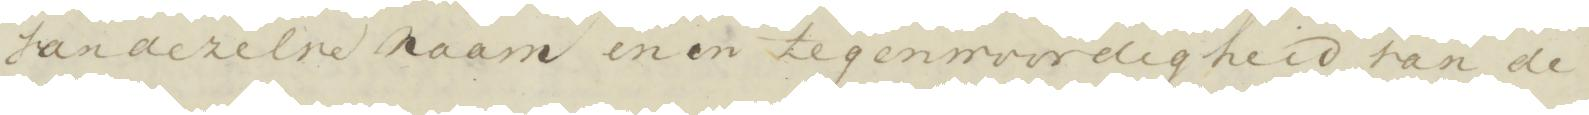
van dezelve naam en in tegenwoordigheid van de
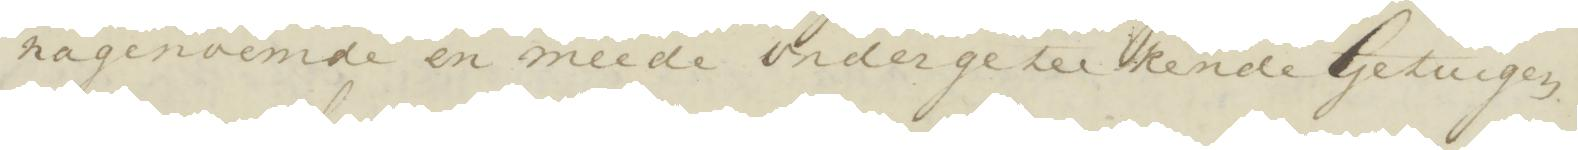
nagenoemde en meede ondergeteekende getuigen
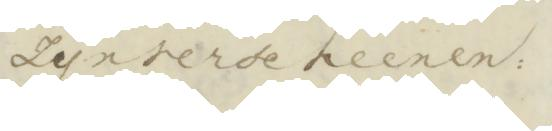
zijn versekeeren:
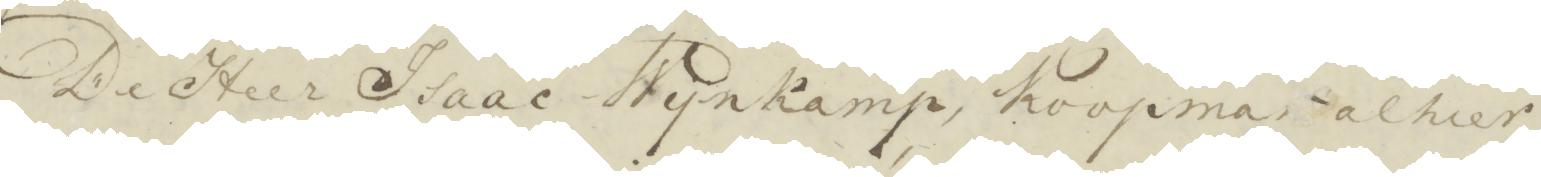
De Heer Isaac Wijnkamp, koopman alhier
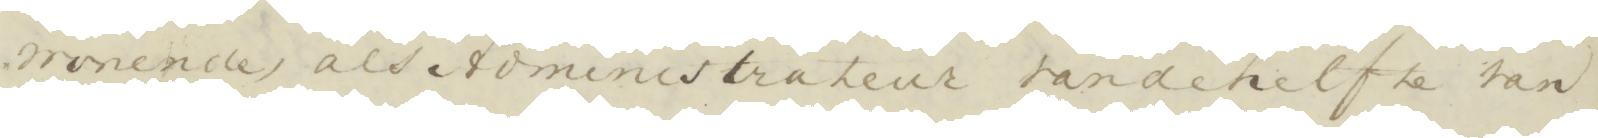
wonende, als Administrateur van de helfte van
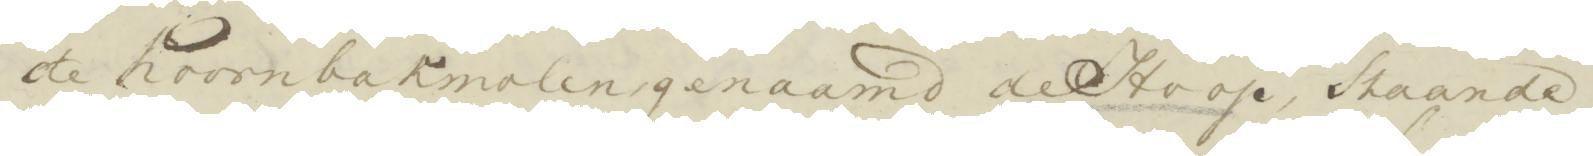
de Koornbakmolen, genaamd de Hoop, staande
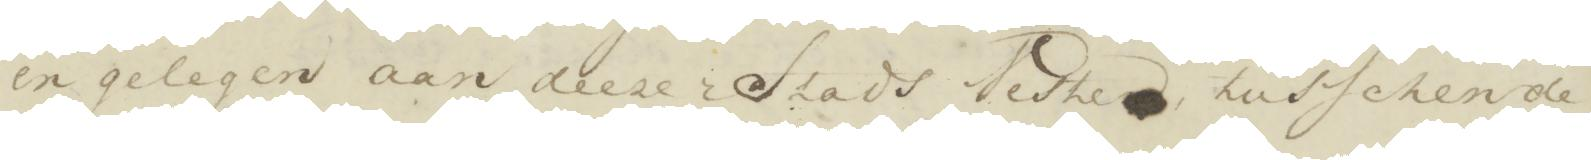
en gelegen aan deezer Stads Veste, tusschen de
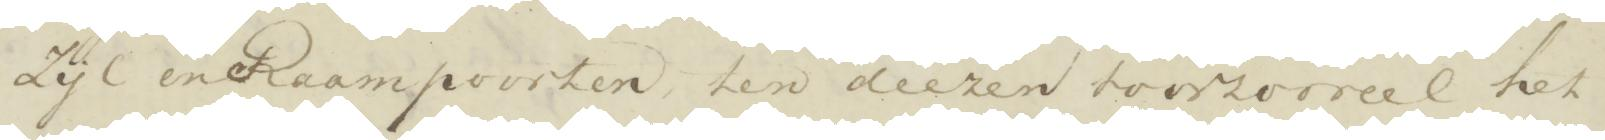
zijl en Raampoorten, ten deezen voorzooveel het
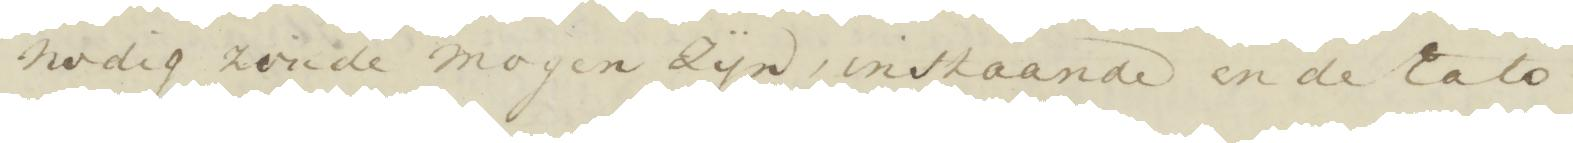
nodig zoude mogen zijn, instaande en de rato
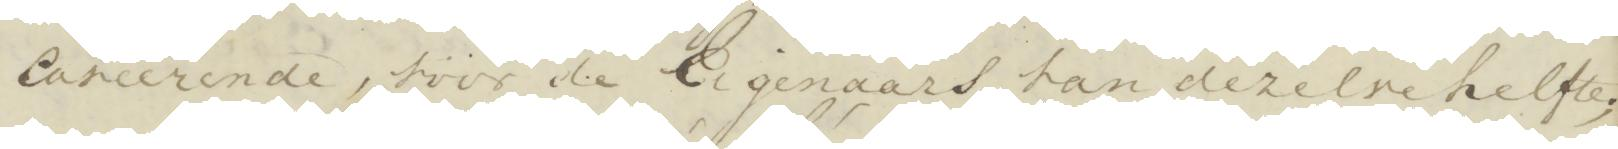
caveerende, voor de Eigenaars van dezelve helfte;
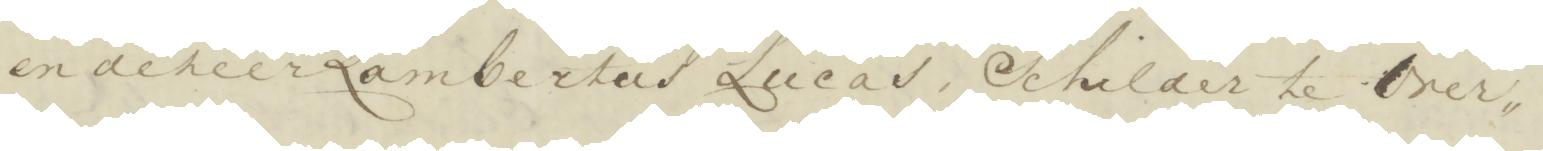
en de heer Lambertus Lucas, Schilder te Over„
